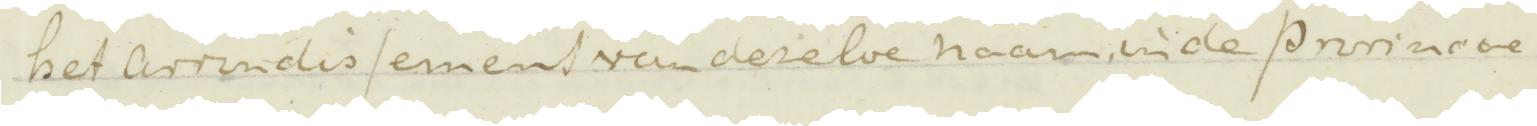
het Arrondissement van dezelve naam, in de Provincie
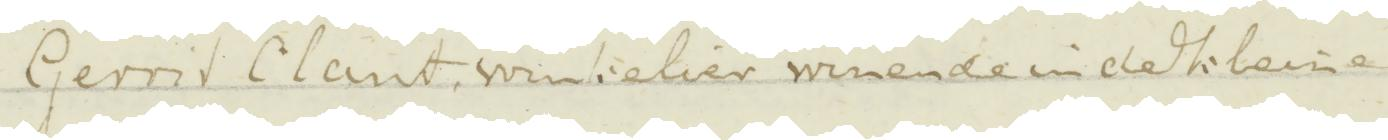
Gerrit Clant, winkelier wonende in de kleine
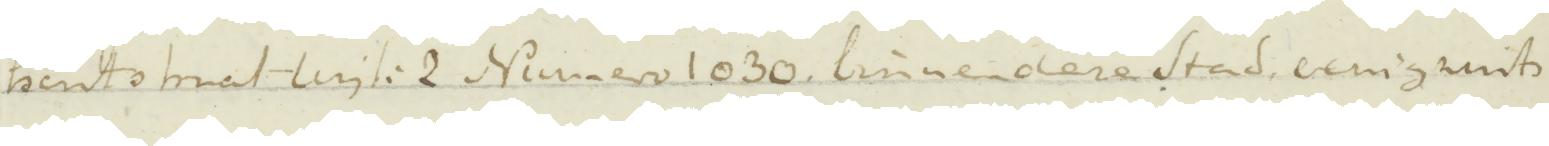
houtstraat wijk 2 Numero 1030. binnen deze stad, eenigzints
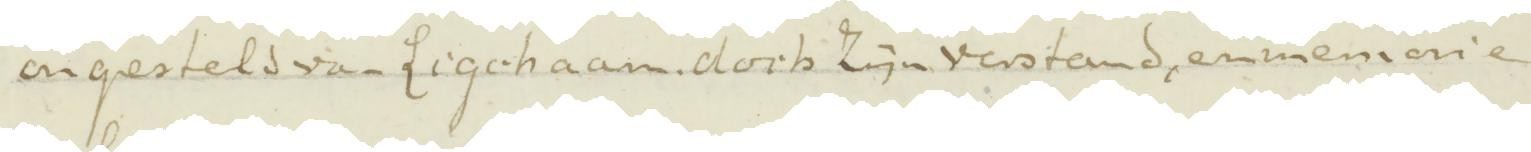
ongesteld van Lichaam, doch zijn verstand, en memorie
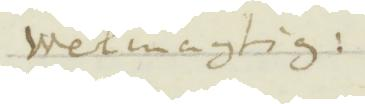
welmagtig:
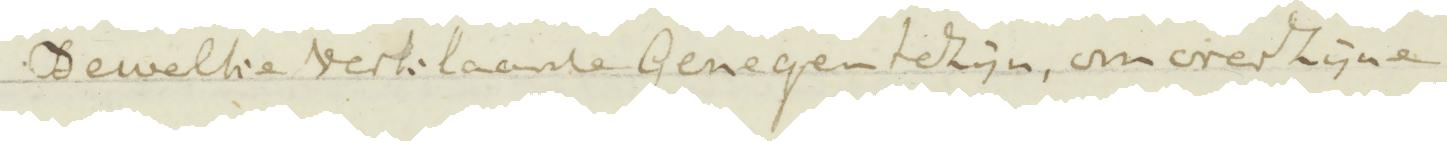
Dewelke verklaarde Genegen te zijn, om over zijne
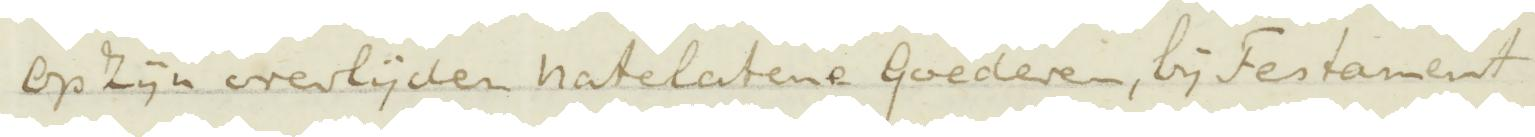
op zijn overlijden natelatene goederen, bij Testament
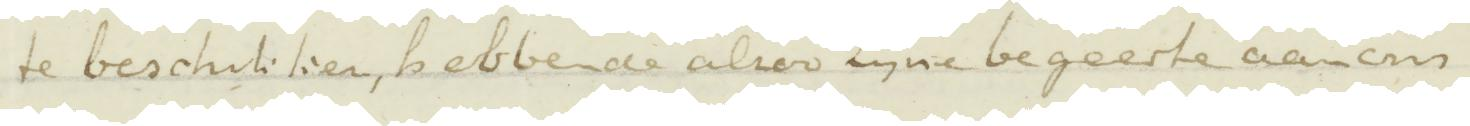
te beschikken, hebbende alzoo zijne begeerte aan om
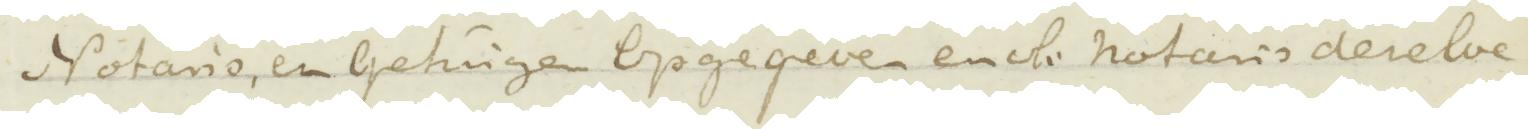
Notaris, en Getuigen opgegeven en ik notaris dezelve
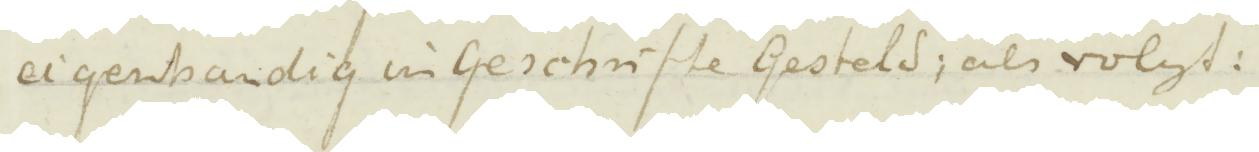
eigenhandig in geschrifte gesteld; als volgt:
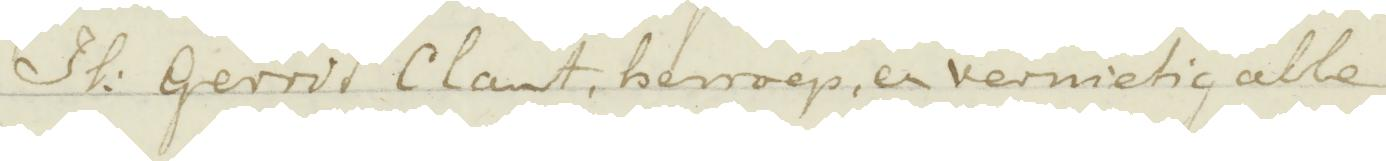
Jk Gerrit Clant, herroep, en vernietig alle
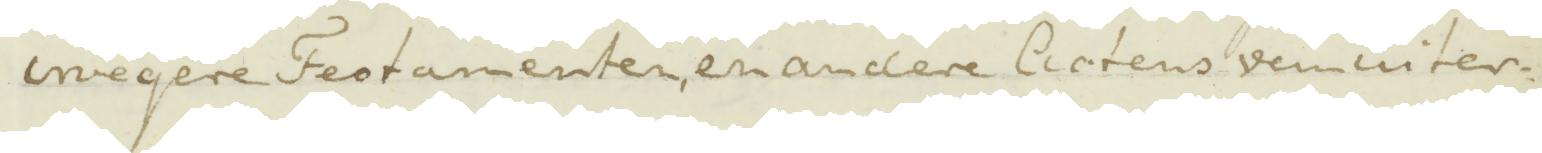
vroegere Testamenten, en andere Actens van uiter=
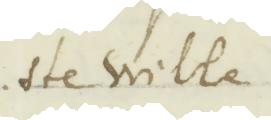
ste wille
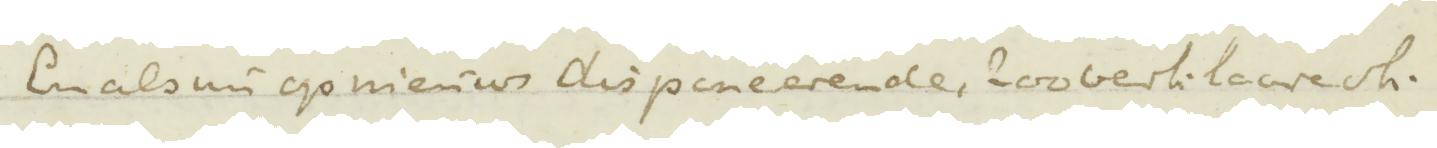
En als nu op nieuws disponeerende, zoo verklaare ik
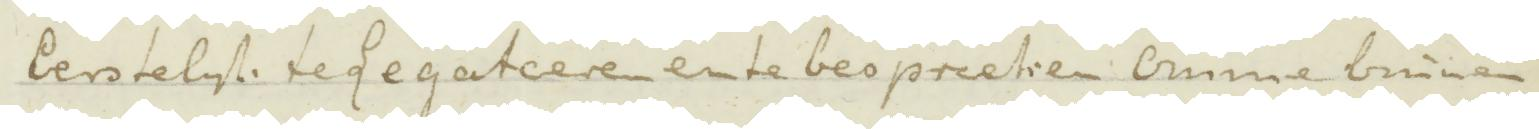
Eerstelijk te Legateeren en te bespreeken omme binnen
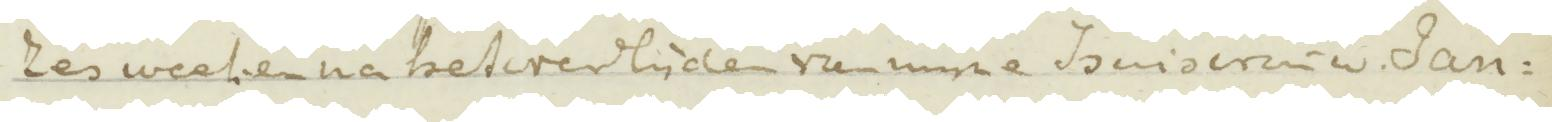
zes weeken na het overlijden van myne huisvrouw Jan=
